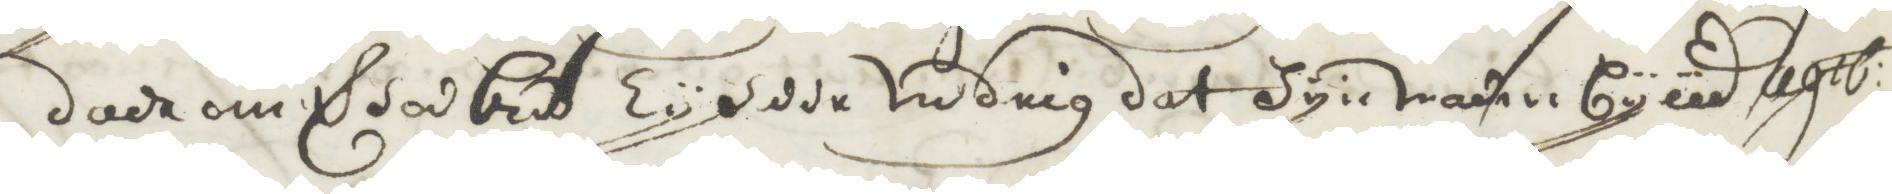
daer om versoeke hij seer nedrig dat Sijn naem bij uE Agtb:
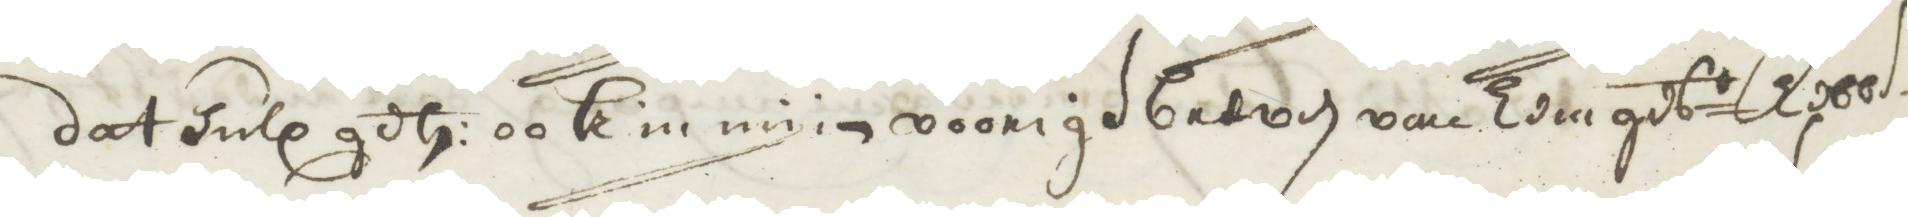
dat sulx gelijk ook in mijn voorige briven van hem ges=t hebbe
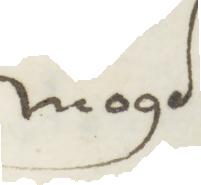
moge
